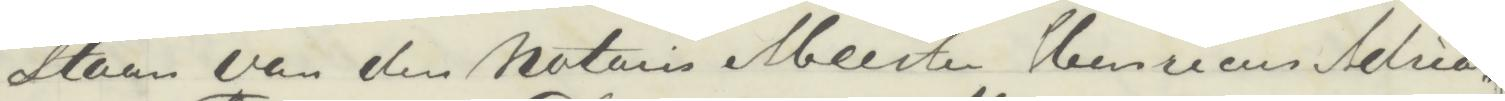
staan van den Notaris Meester Henricus Adria„
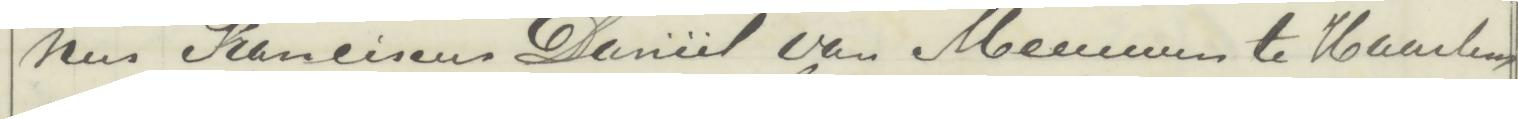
nus Franciscus Daniël van Meeuwen te Haarlem
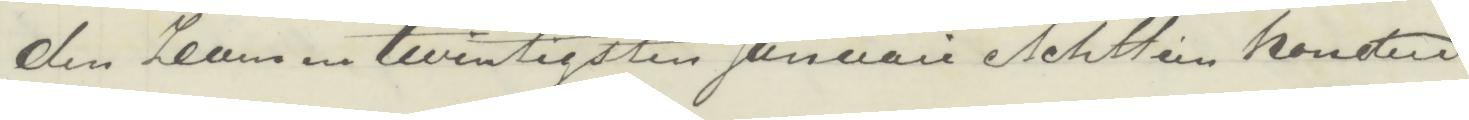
den Zeven en twintigsten Januari Achttien honderd
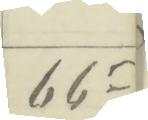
66-5
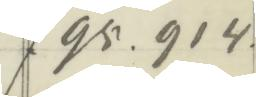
ƒ 95.914
